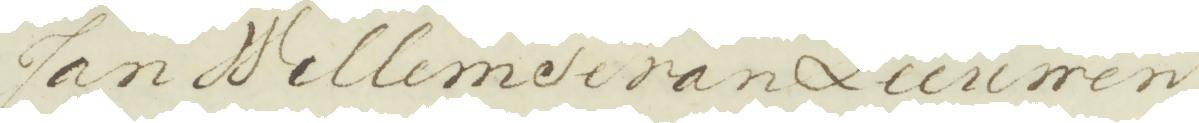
Jan Willemse van Leeuwen
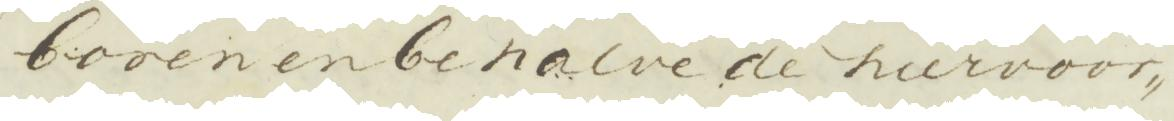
boven en behalve de hiervoor„
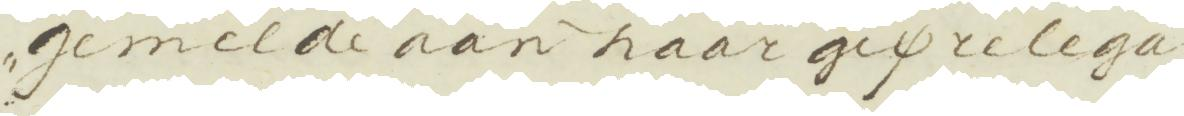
„gemelde aan haar geprelega
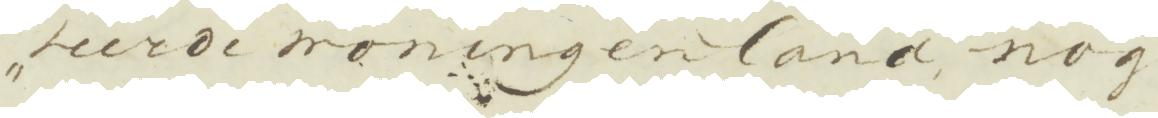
„teerde woning en land, nog
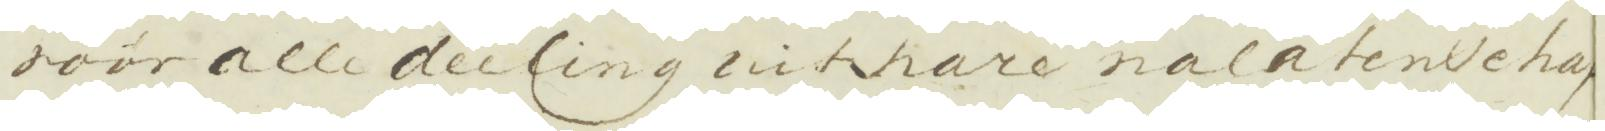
vóór alle deeling uit hare nalatenschap
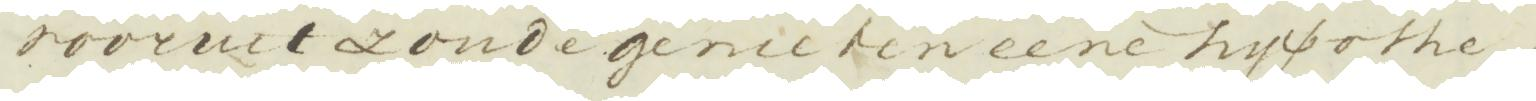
vooruit zoude genieten eene hypothe„
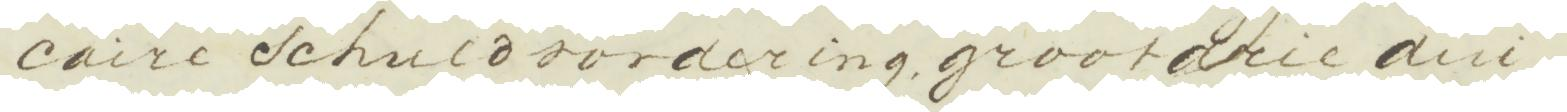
caire Schuldvordering, groot drie dui
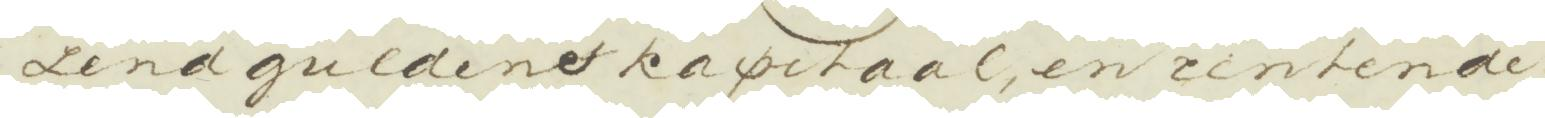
„zend guldens kapitaal, en rentende
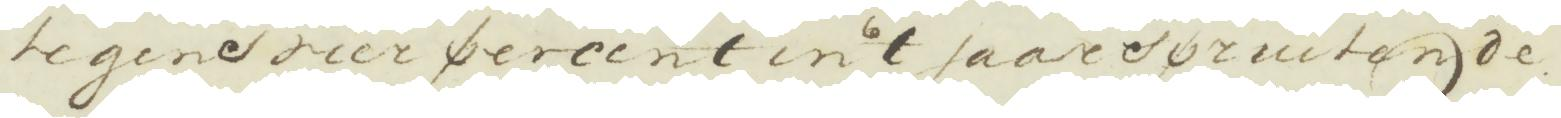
tegens vier percent in ’t Jaar spruitende„
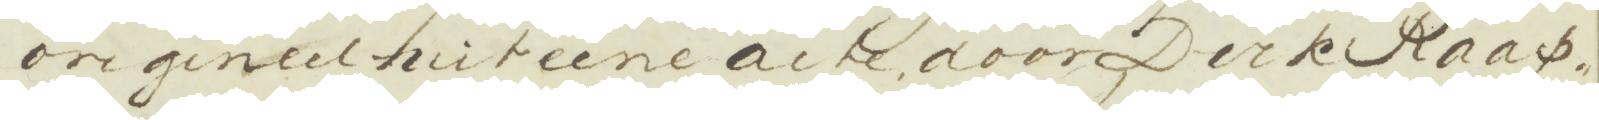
origineel uit eene acte, door Derk Raap„
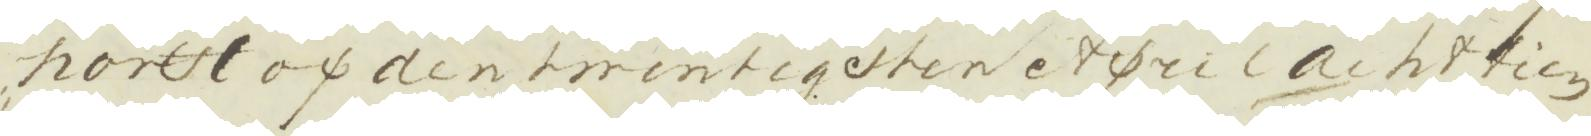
„horst op den twintigsten April achttien
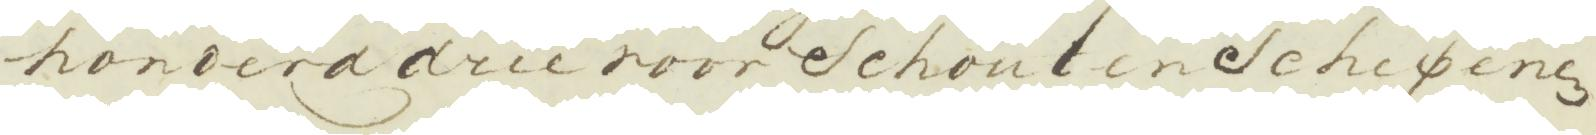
honderd drie voor Schout en Schepenen
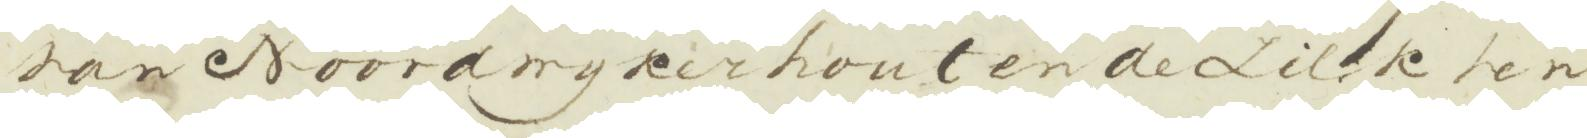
van Noordwykerhout en de Zilk ten
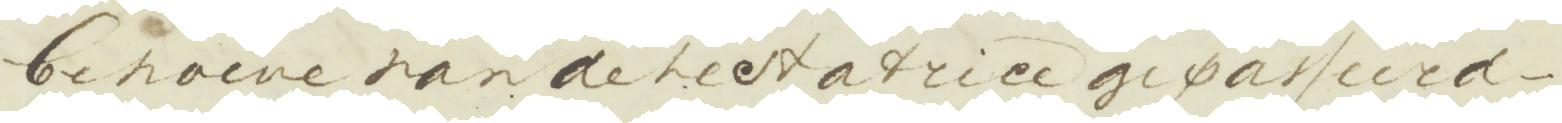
behoeve van de testatrice gepasseerd-
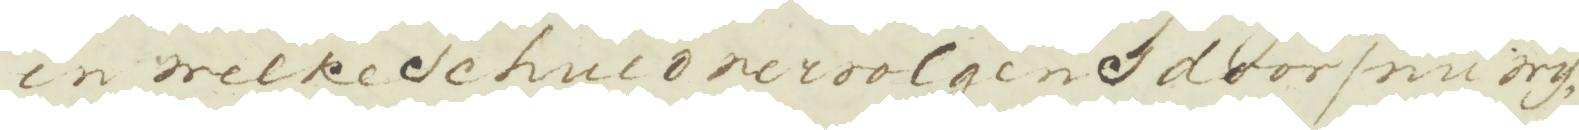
en welke schuld vervolgens door / nu wy„
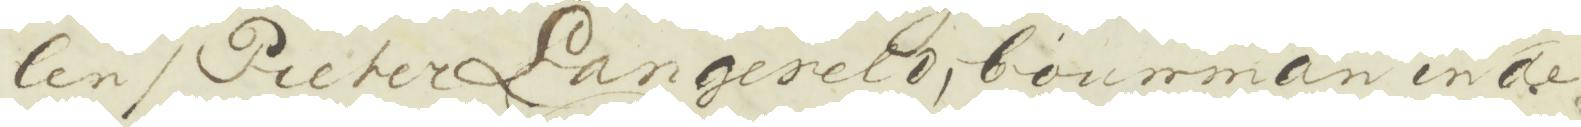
len / Pieter Langeveld, bouwman in de
